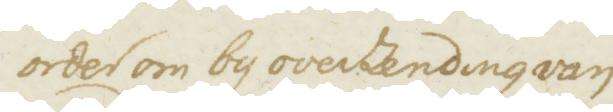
order om by overzending van
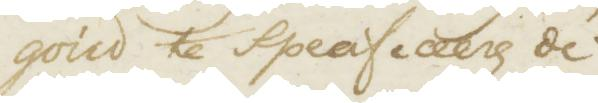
goud te specificeere de
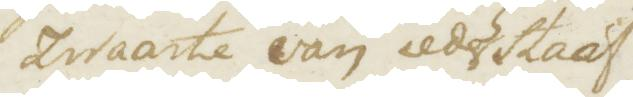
zwaarte van ieder staaf
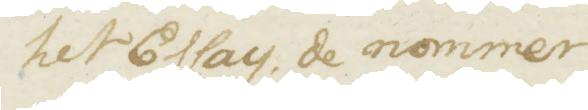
het Essay, de nommer
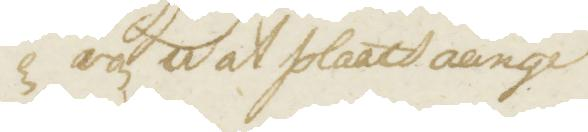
en van wat plaats aange
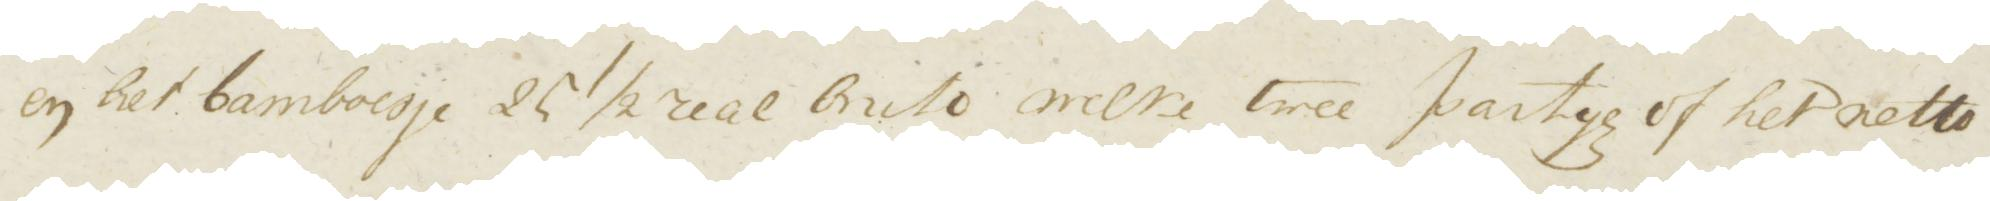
en het bamboesje 25 ½ real bruto welke twee partyen of het netto
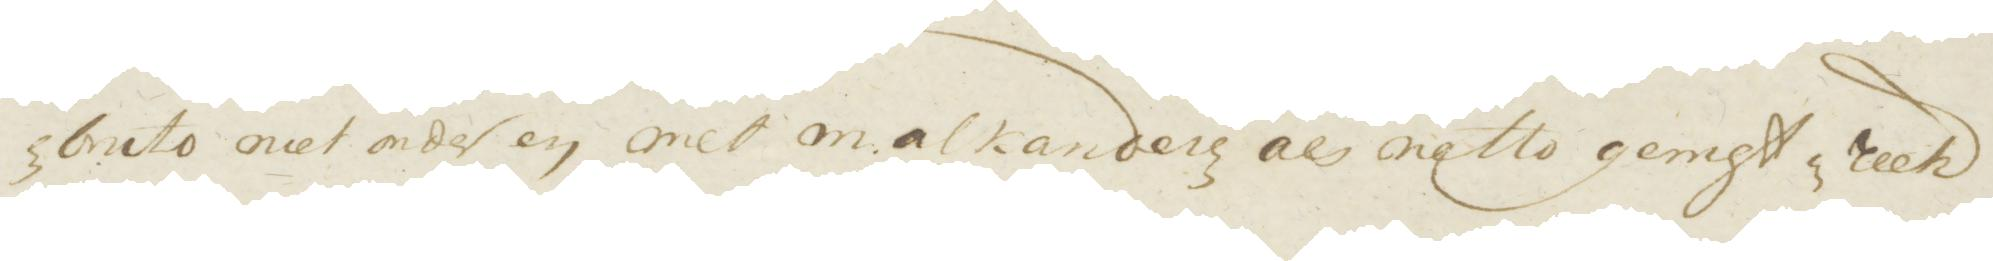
en bruto niet onder en met malkanderen als netto gemengt reets
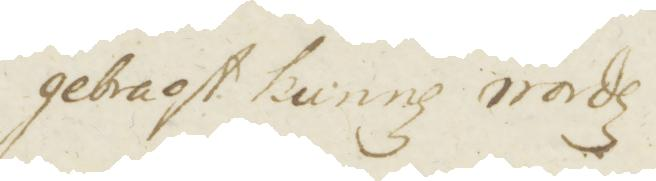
gebragt kunnen worden
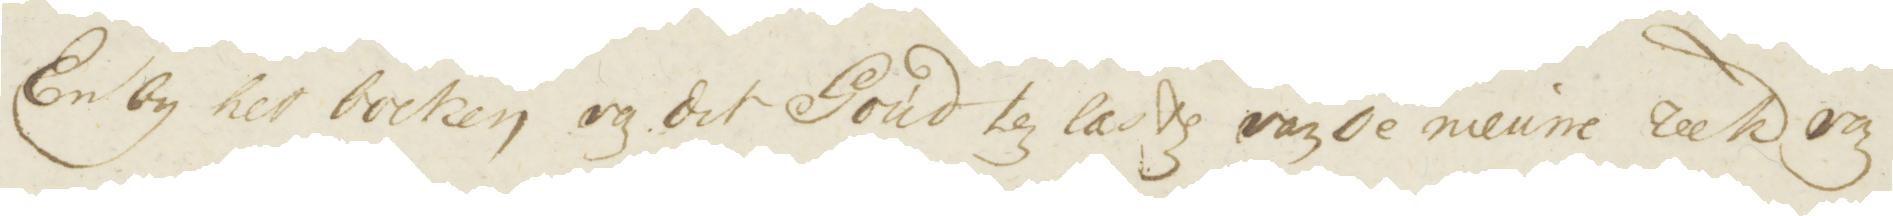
En by het boeken van dit Goud ten lasten van de nieuwe reeks van
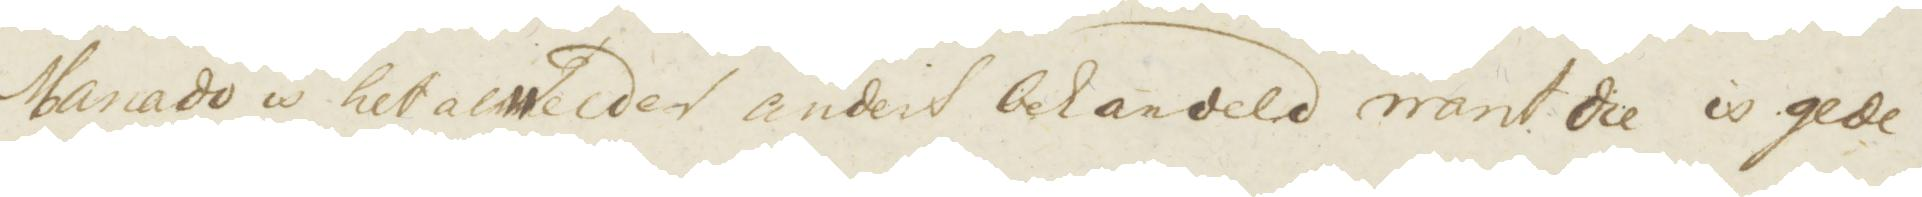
Manado is het als weeder anders behandeld want die is gede
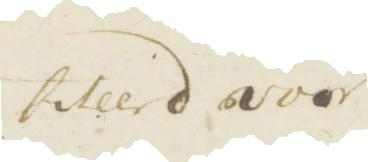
biteerd voor
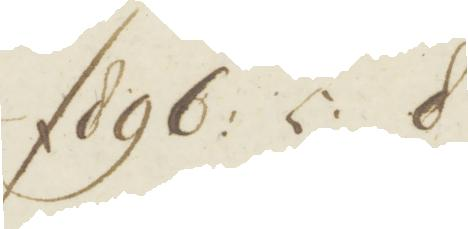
ƒ 896: 5: 8
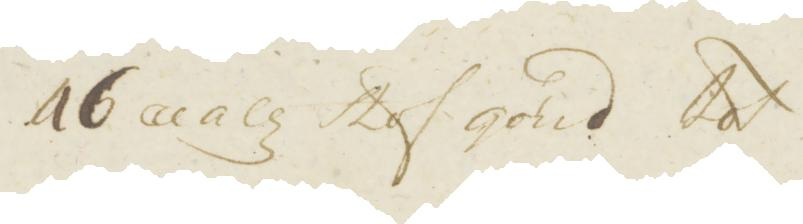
46 realen stof goud tot
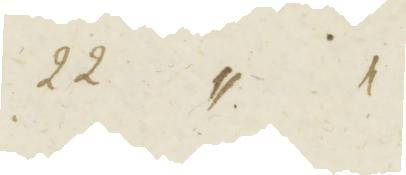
22 „
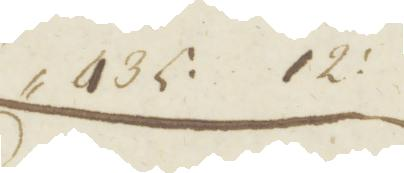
„ 435: 12:
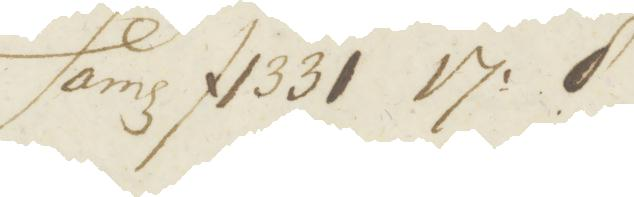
Samen ƒ 1331 17: 8
